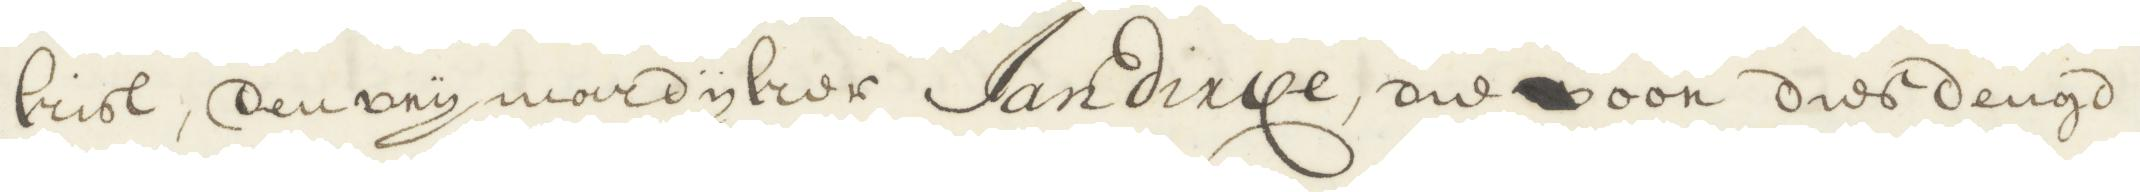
kist, den vrij mardijker Jan dirxe, die voor dies deugd
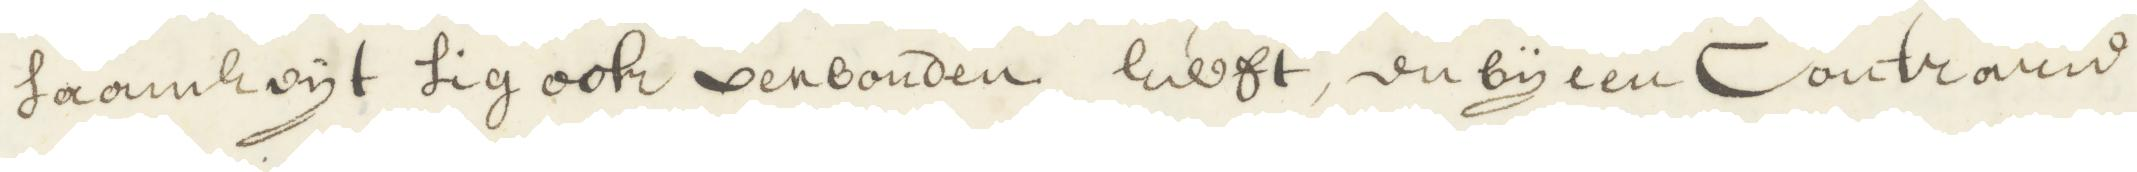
saamheijt sig ook verbonden heeft, en bij een Contrarie
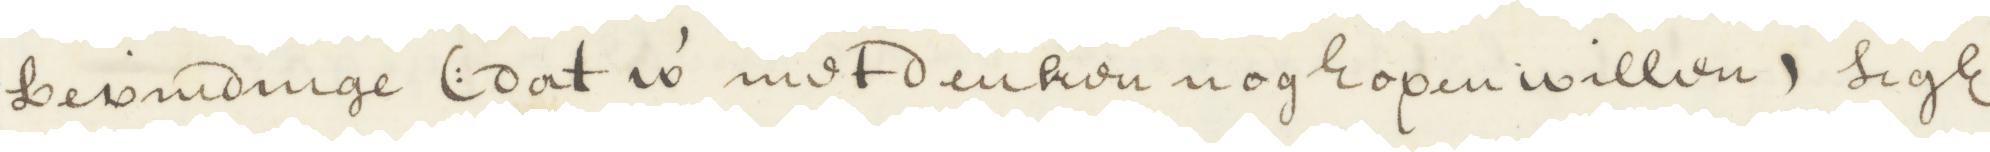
bevindinge (:dat w' niet denken nog hopen willen) sigh
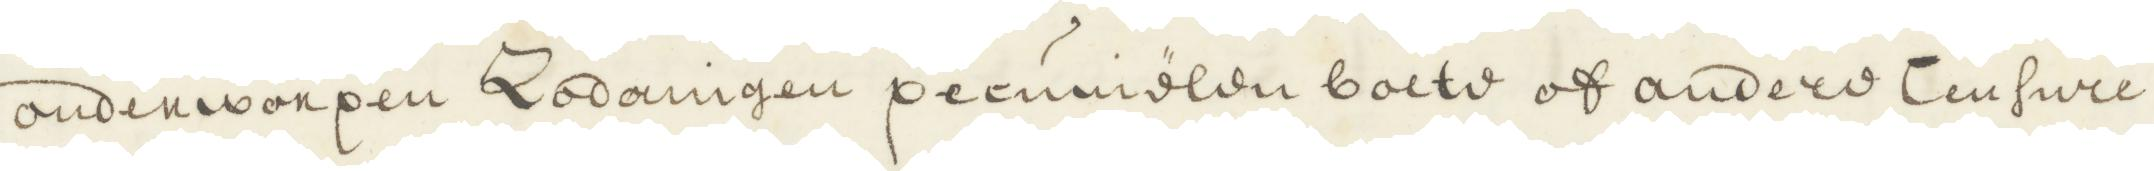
onderworpen zodanigen pecuniëlen boete of andere Censure,
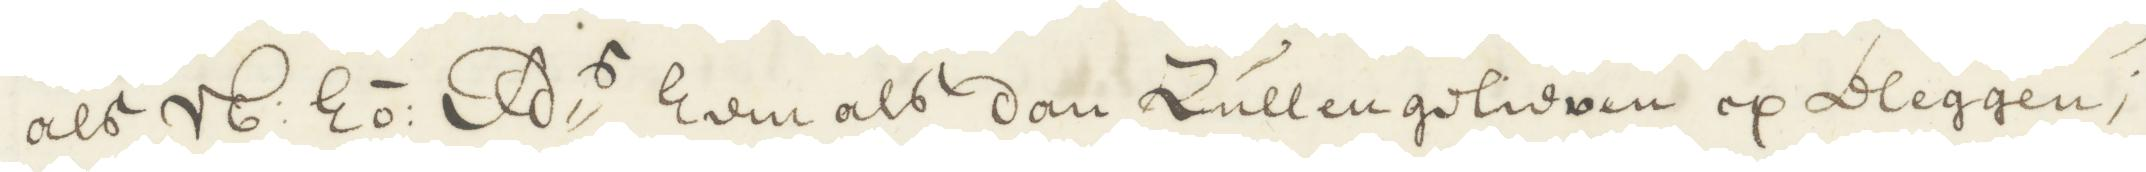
als VE: ho: Ed„s hem als dan zullen gelieven op teleggen;
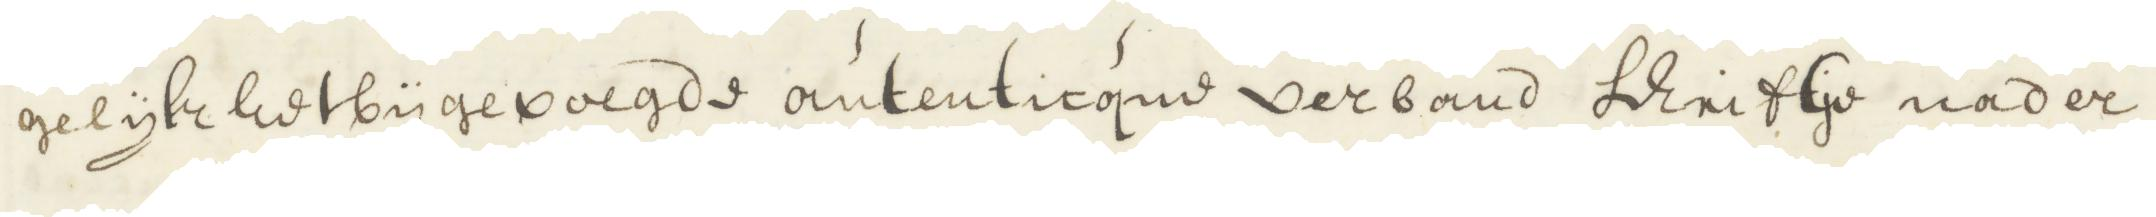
gelijk het bij gevoegde autenticque verband schriftje nader
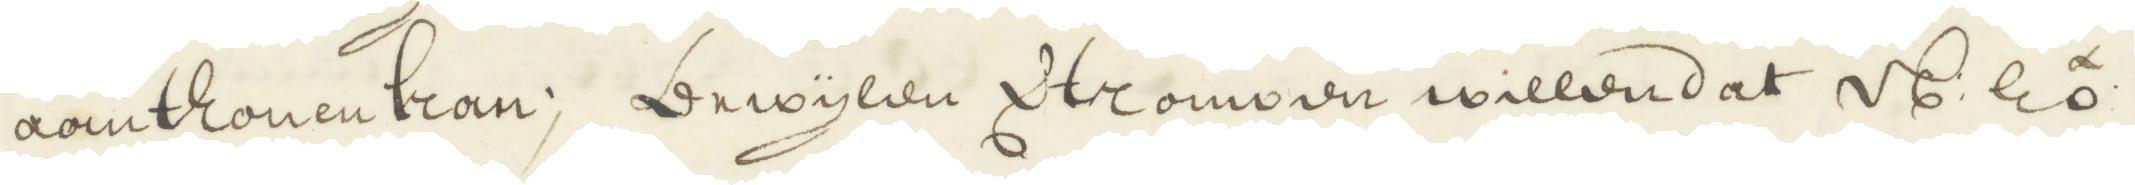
aanthonen kan; terwijlen vertrouwen willen dat VE: ho:
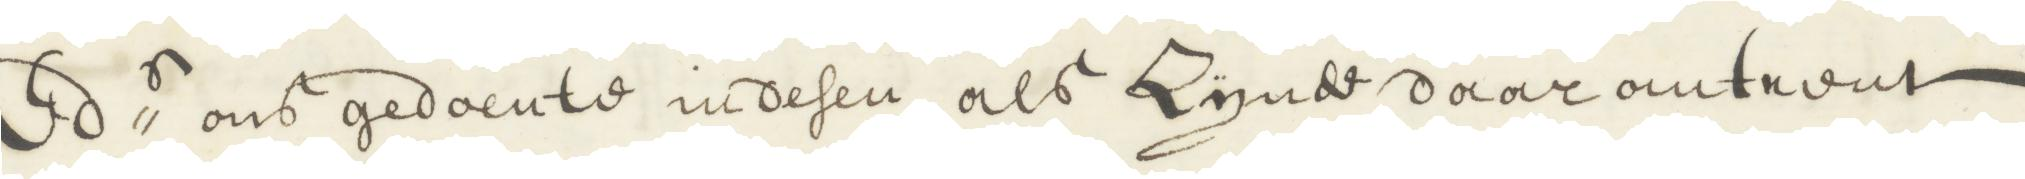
Ed„s ons gedoente in desen, als zijnde daar omtrent
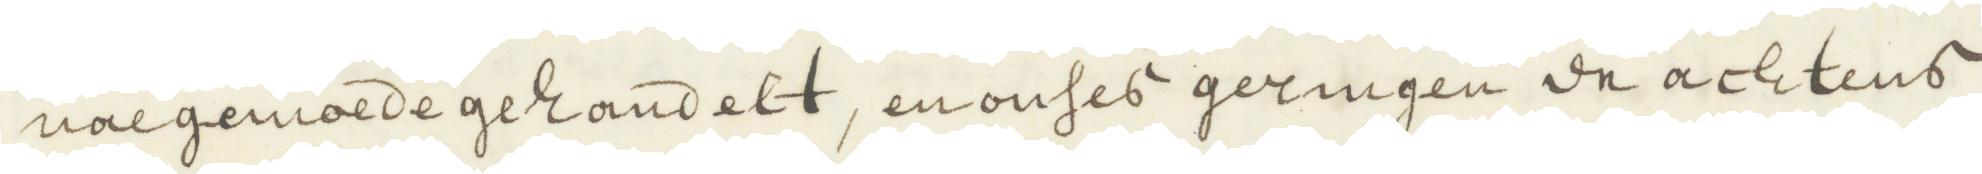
nae gemoede gehandelt, en onses geringen 'er achtens
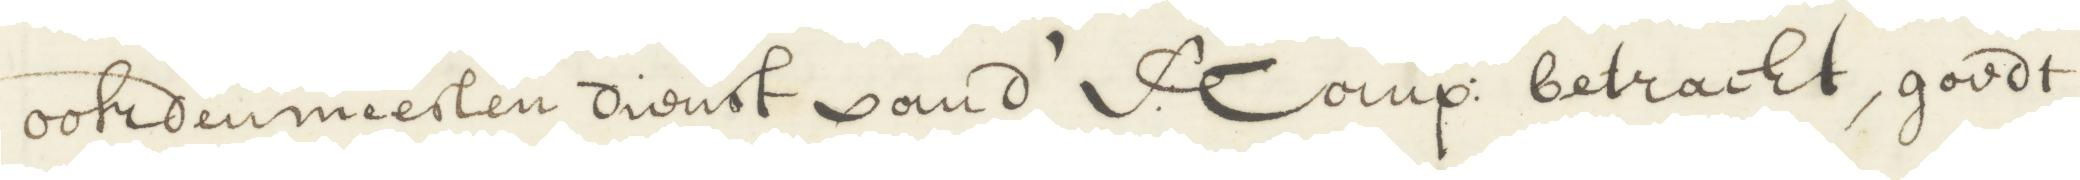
ook den meesten dienst van d’ E: Comp: betracht, goedt
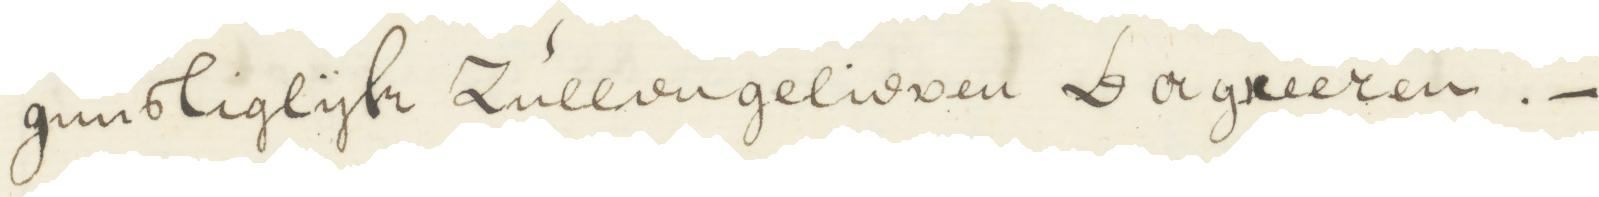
gunstiglijk zullen gelieven te agreëren._
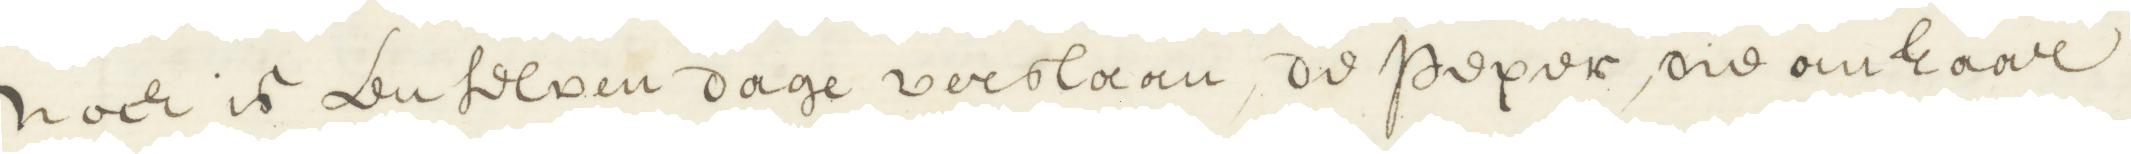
noch is ten selven dage verstaan, de peper, die om haar
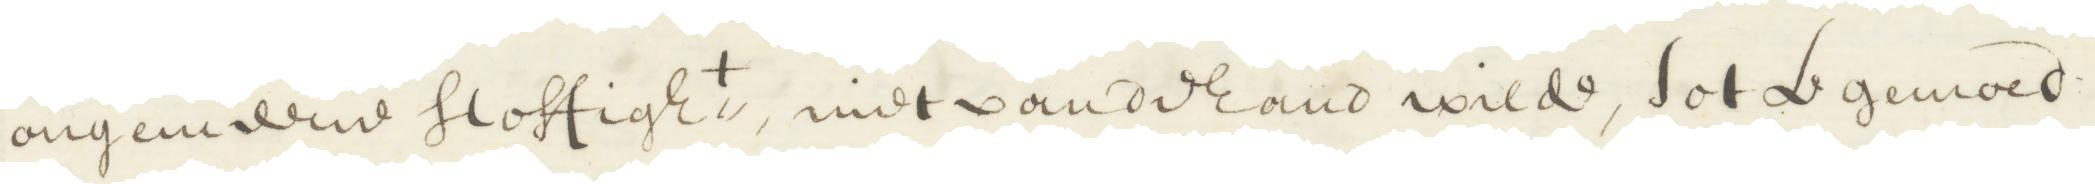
ongemeene stoffigh„t, niet van de hand wilde, tot te gemoed
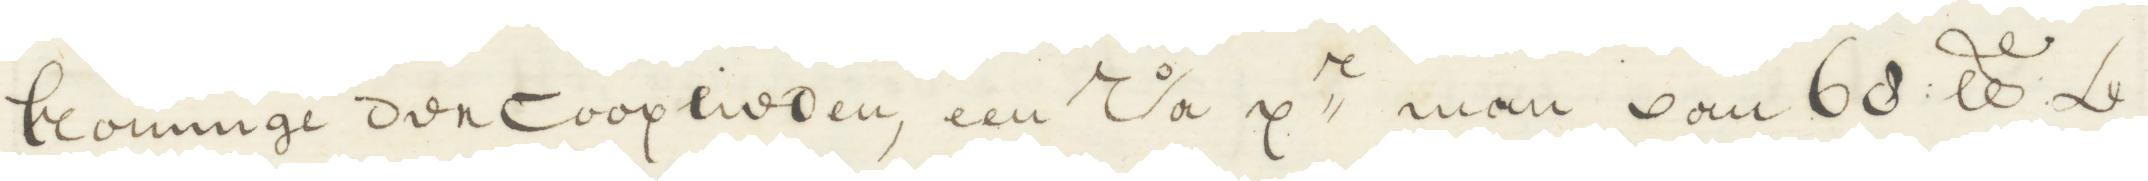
kominge der cooplieden, een ro/a p„r man van 68: lb: te
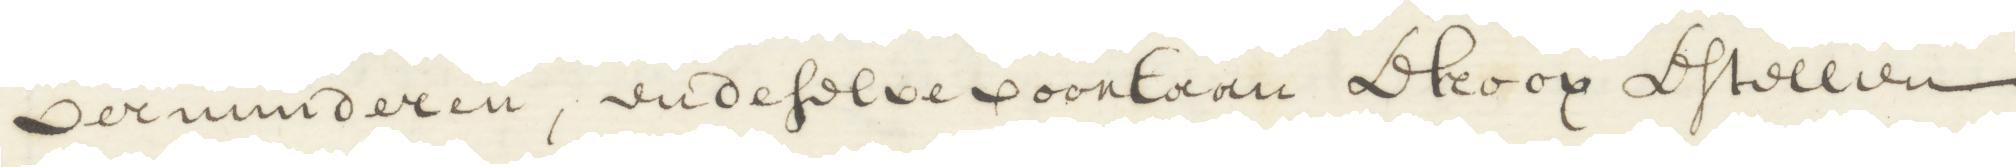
verminderen, en deselve voortaan te koop testellen
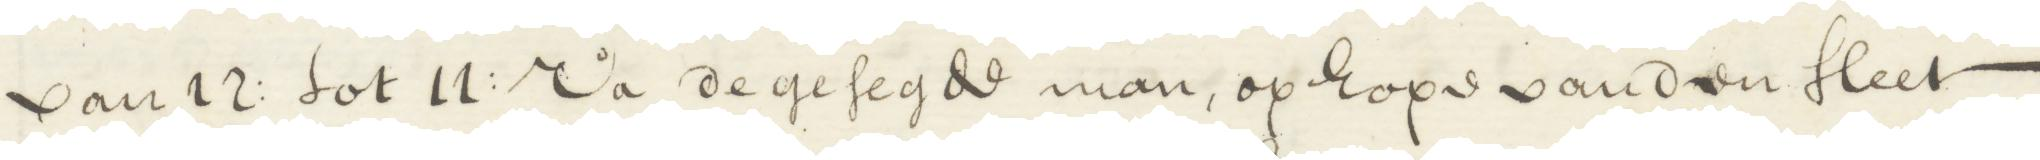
van 12: tot 11: roa de gesegde man, op hope van den sleet
